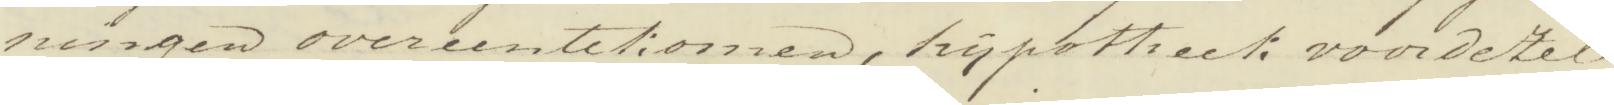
ningen over eentekomen, hijpotheek voor deZel
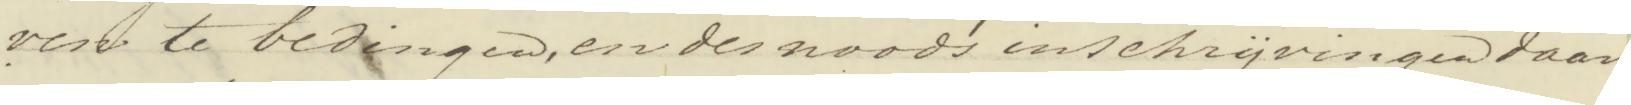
ven te bedingen, en des noods inschrijvingen daar
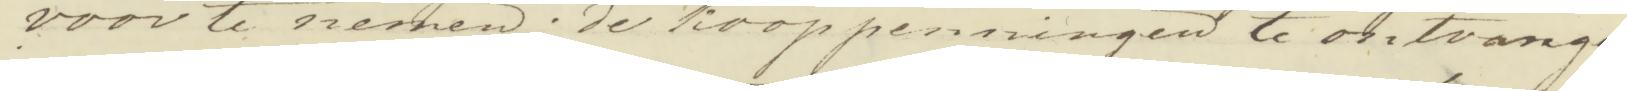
voor te nemen de kooppenningen te ontvangen
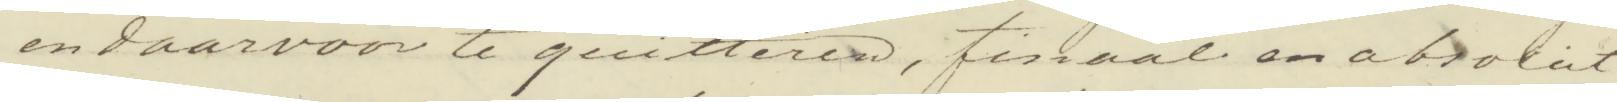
en daarvoor te quitteren, finaal en absolut
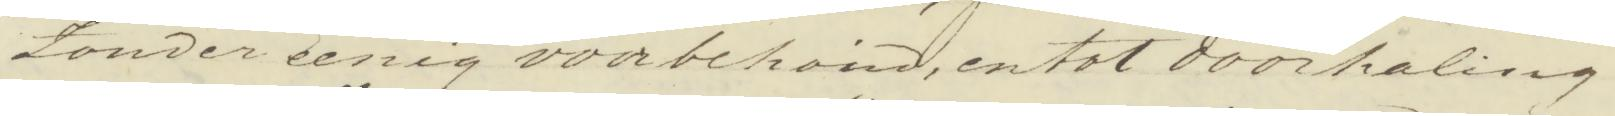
zonder eenig voorbehoud, en tot doorhaling
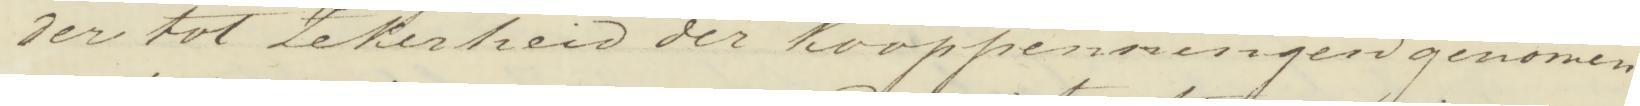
der tot Zekerheid der kooppenningen genomen
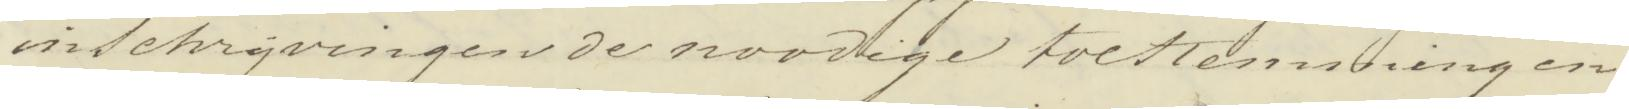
inschrijvingen de noodige toestemming en
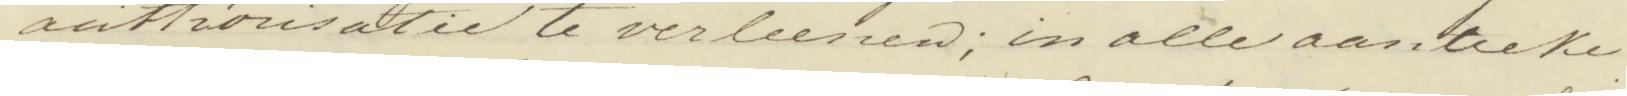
authorisatie te verleenen; in alle aanteeke
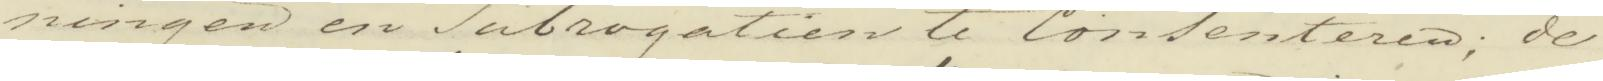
ningen en subrogatien te Consenteren: de
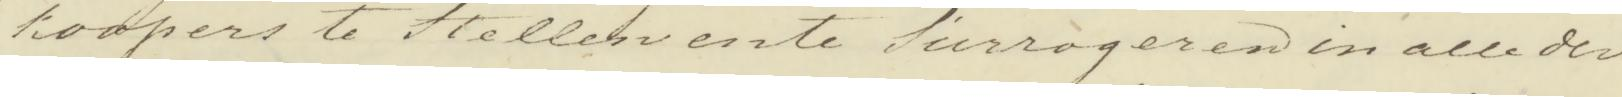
koopers te stellen en te surrogeren in alle der
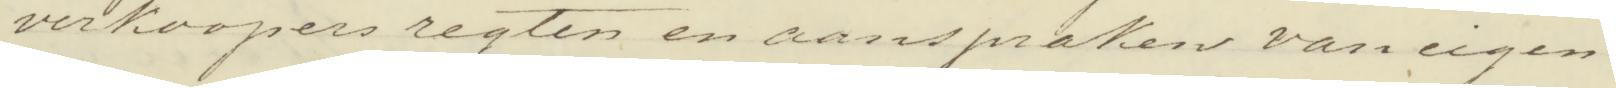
verkoopers regten en aanspraken van eigen
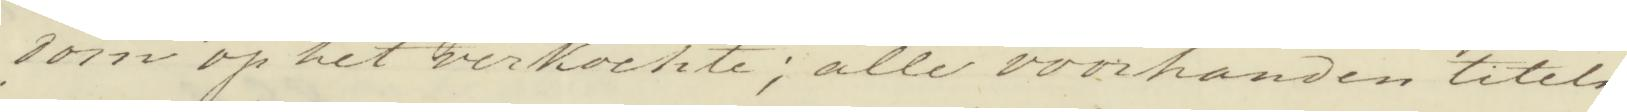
dom op het verkochte; alle voorhanden titels
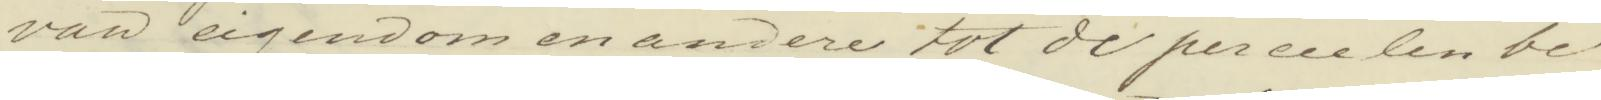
van eigendom en andere tot de perceelen be
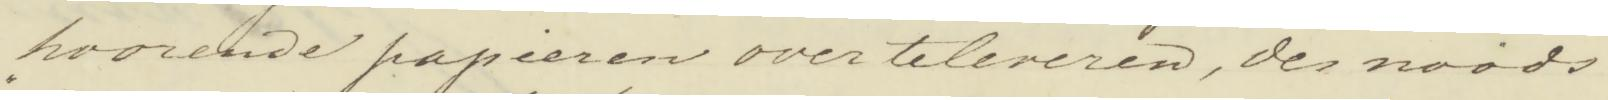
hoorende papieren over televeren, des noods
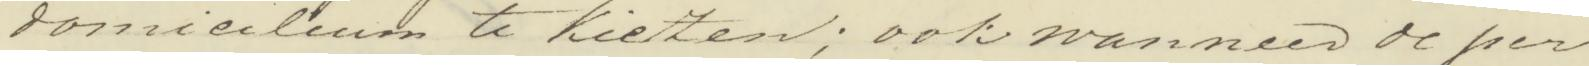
domicilium te kieZen; ook wanneer de per
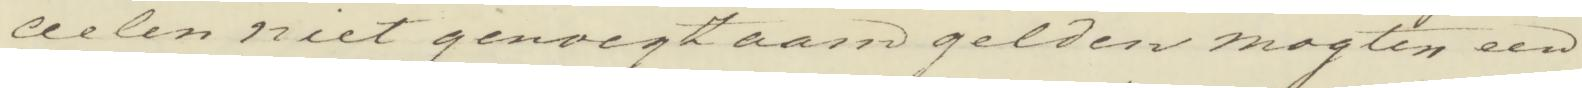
ceelen niet genoegZaam gelden mogten een
